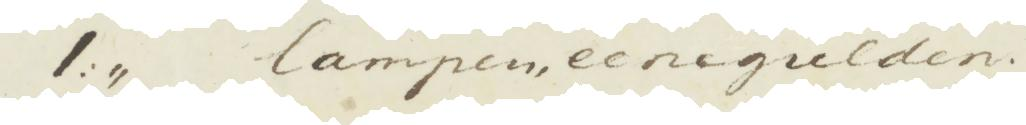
1:„ lampen, eene gulden.
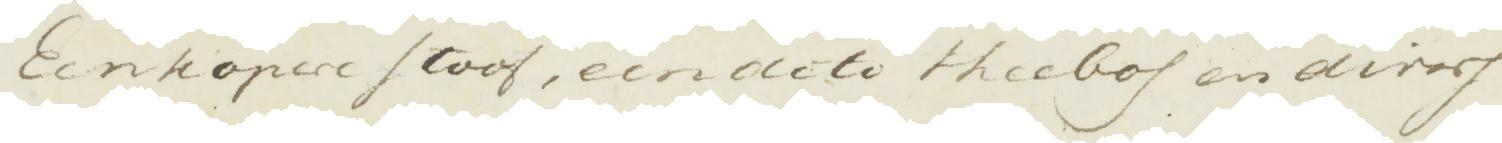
Een kopere stoof, een dito theebof en divers
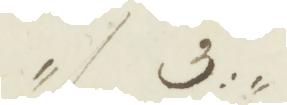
„ 3: „
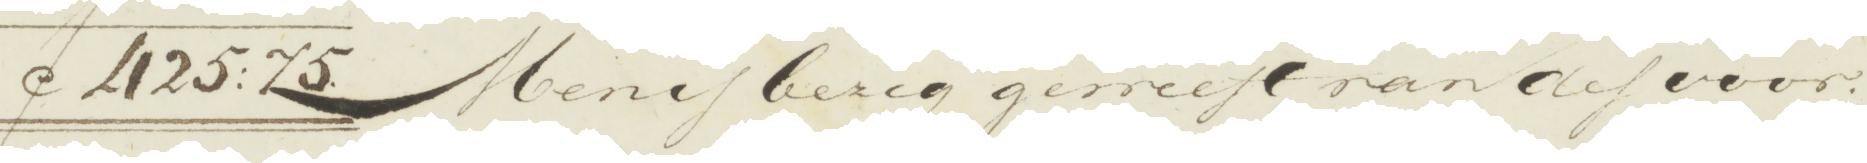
ƒ425:75 Men is bezig geweest van des voor.
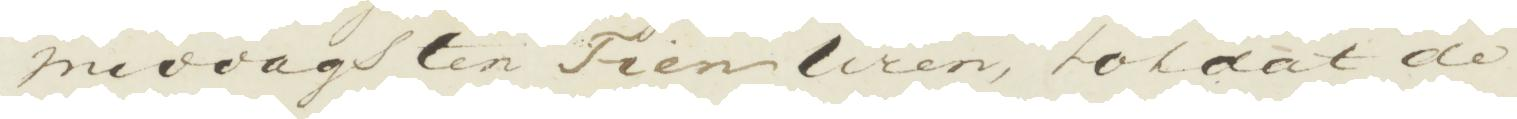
middags ten Tien uren, totdat de
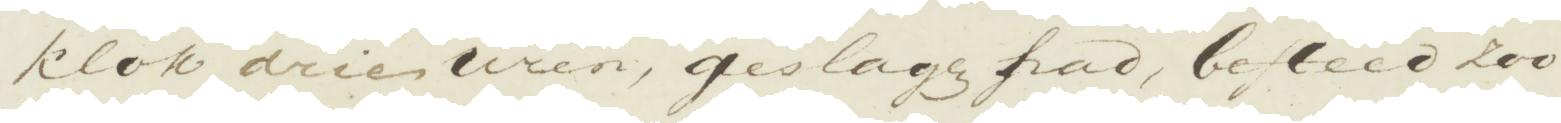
klok drie uren, geslagen had, besteed zoo
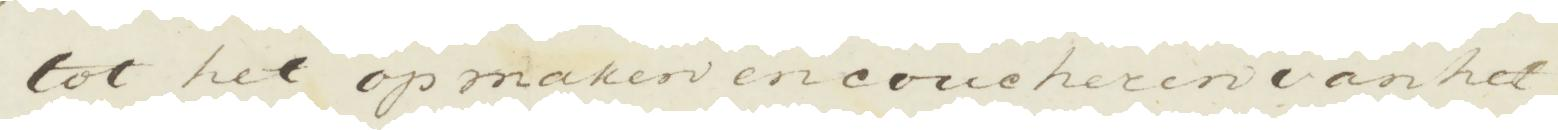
tot het op maken en coucheren van het
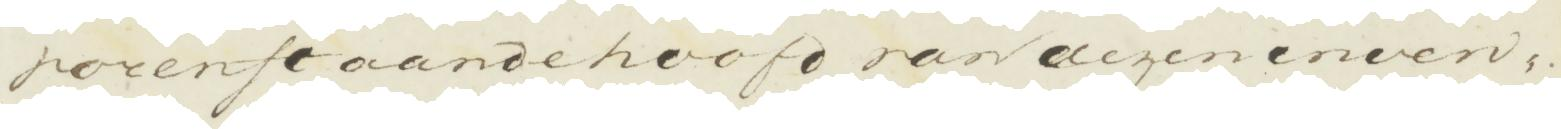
vorenstaande hoofd van dezen inven„
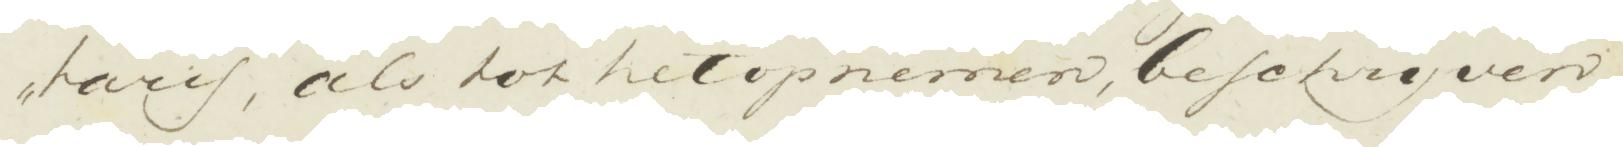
„taris, als tot het opnemen, beschryven
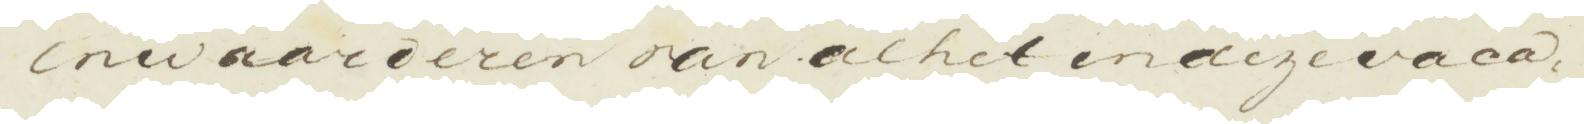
en waarderen van al het in deze vaca„
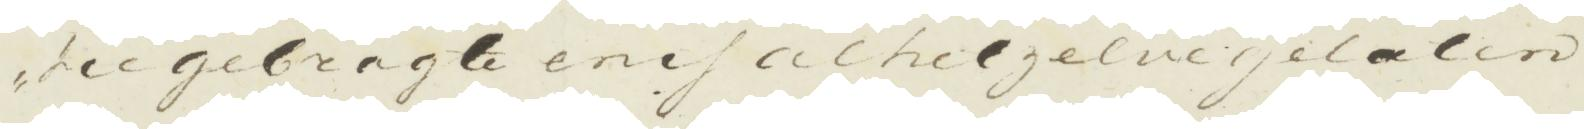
„tie gebragte en is al hetzelve gelaten
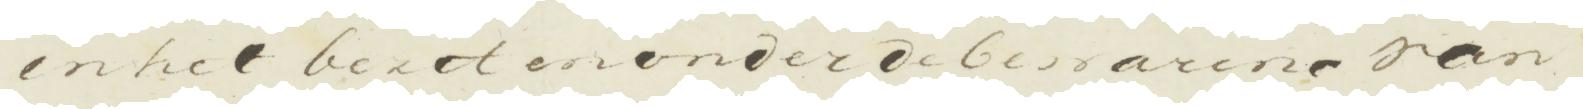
in het bezit en onder de bewaring van
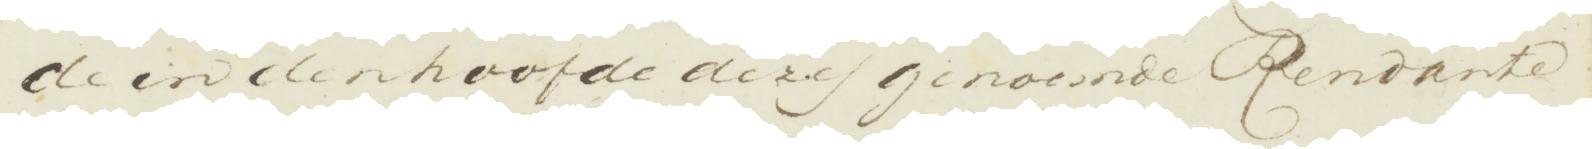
de in den hoofde dezes genoemde Rendante
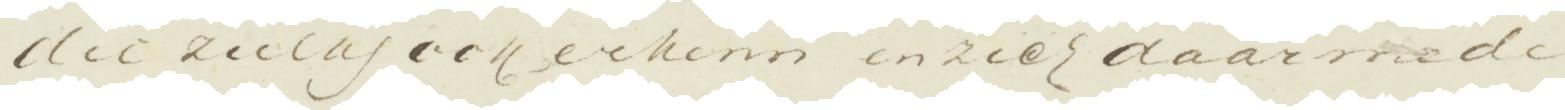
die zulks ook erkenn en zich daarmede
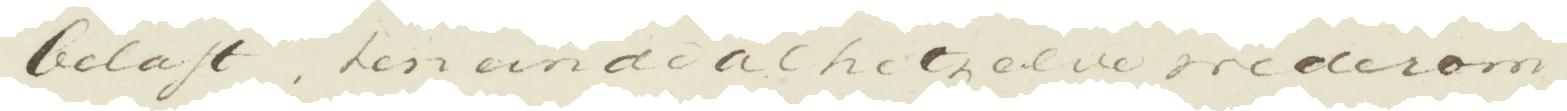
belast, ten einde al hetzelve wederom
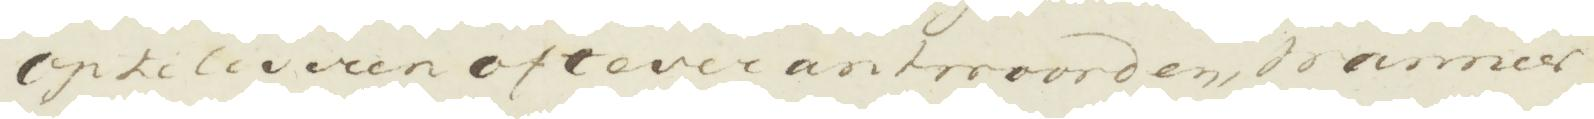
op te leveren of te verantwoorden, wanneer
